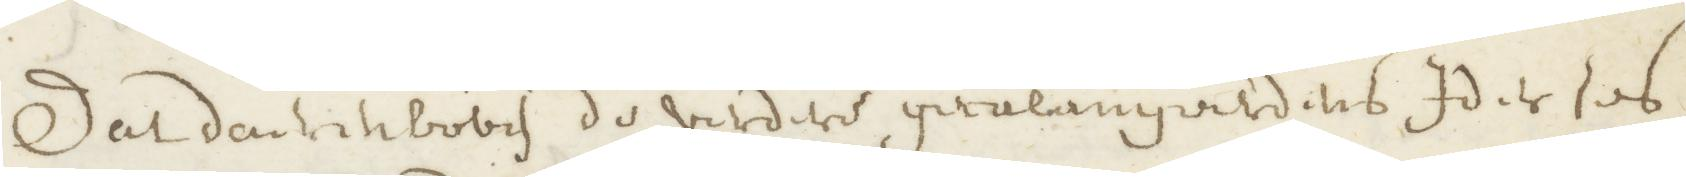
Dat daerenboven de verdere gecalangeerdens Jder ses
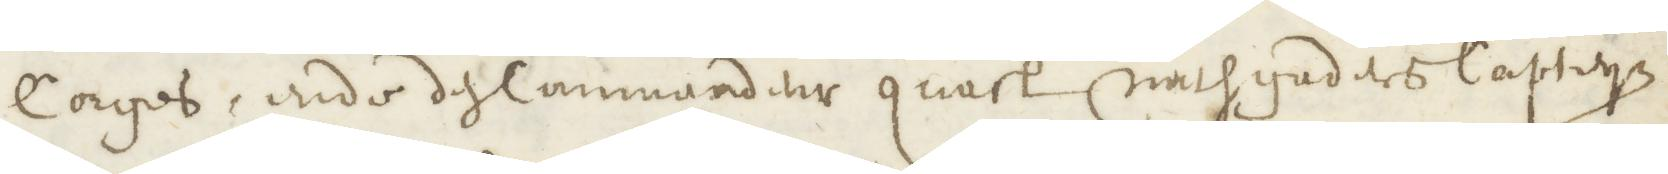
Corges, ende den Commandeur quast mitsgaders Capteyn
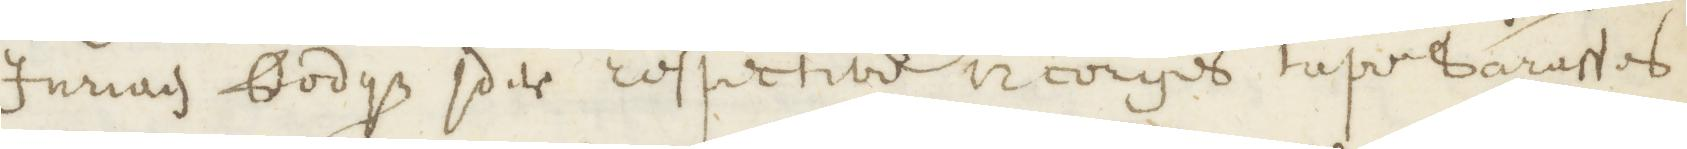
Juriaen Bodijn der respective in corges tepe sarattes
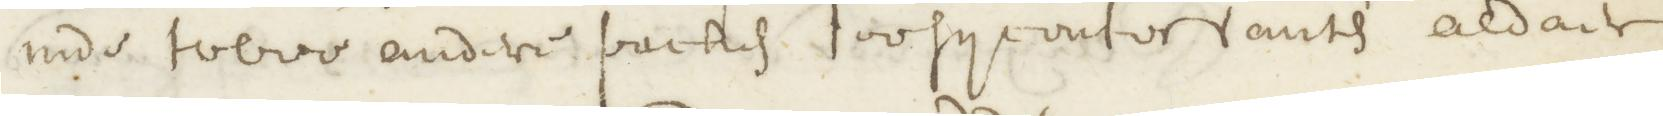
inde twee andere packen soo sy contestanten aldaer
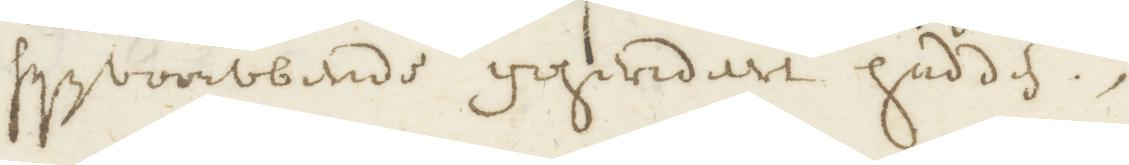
syn voorwende geherideert hadden.
